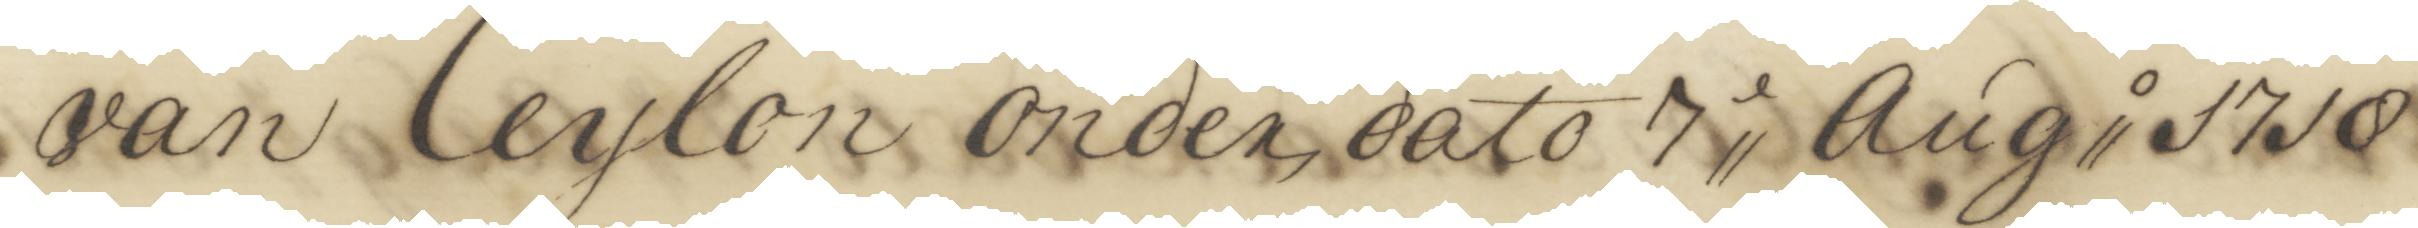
van Ceijlon onder dato 7„e Aug„o 1718
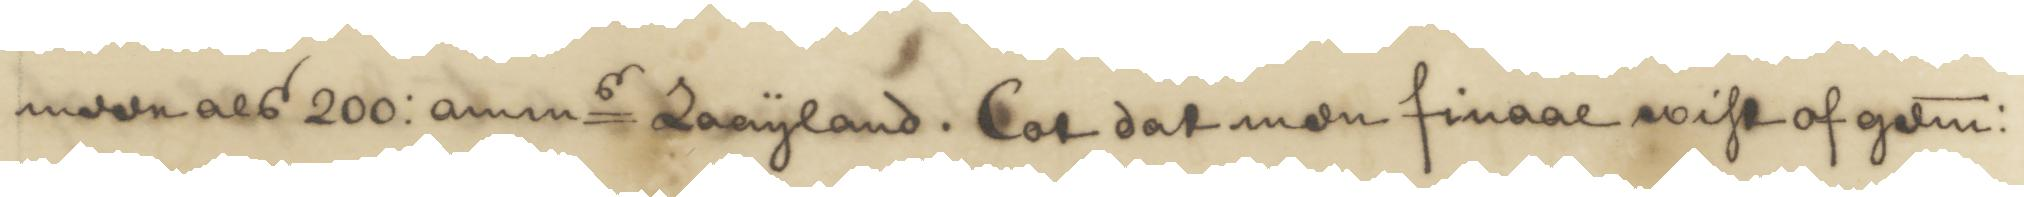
meer als 200: amm=s Zaaijland. tot dat men finaal wist of gem:
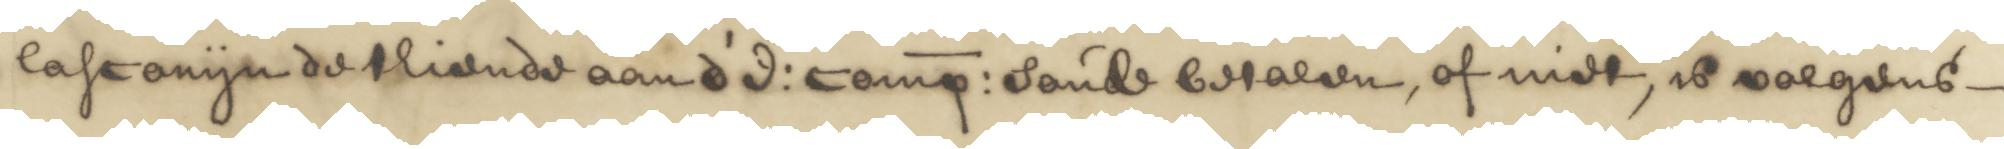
lascarijn de thiende aan d’ E: comp: soude betalen, of niet, is volgens
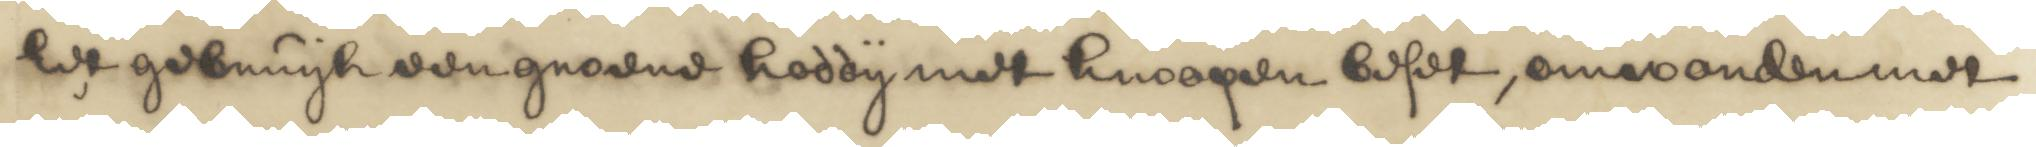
het gebruijk een groene koddij met knoopen beset, omwonden met
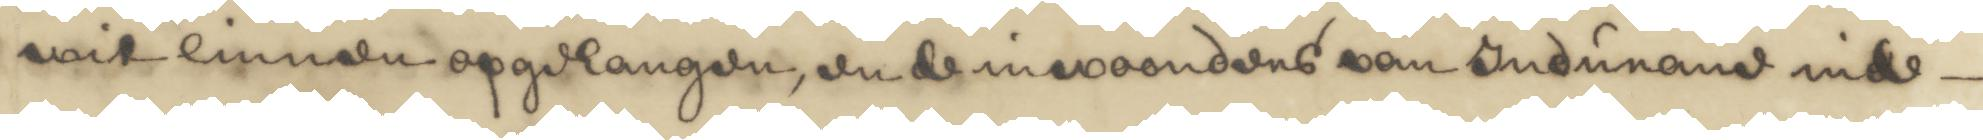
wit linnen opgehangen, en de inwoonders van Indurane inde
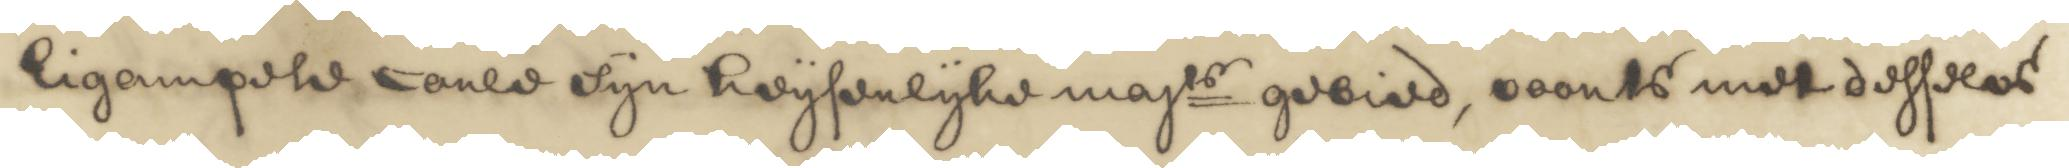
higampele corle sijn keijserlijke maj=ts gebied, voorts met desselvs
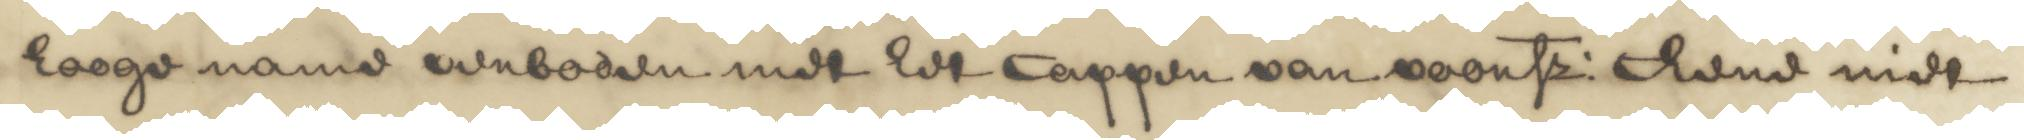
hooge name verboden met het cappen van voorsz: chene niet
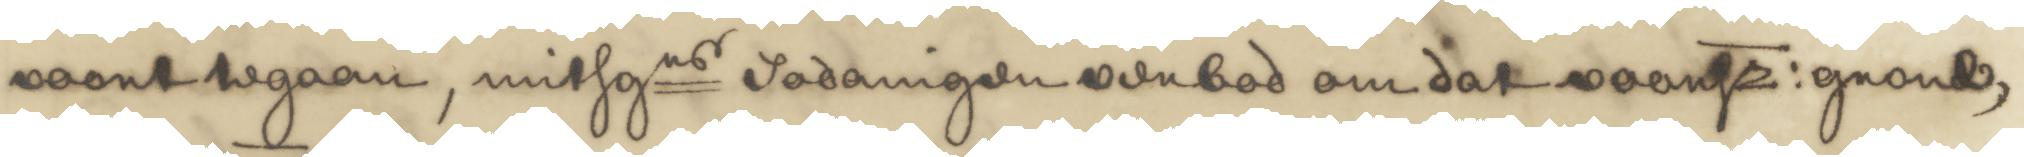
voort tegaan, mitsg=rs sodanigen verbod om dat voorsz: gronden
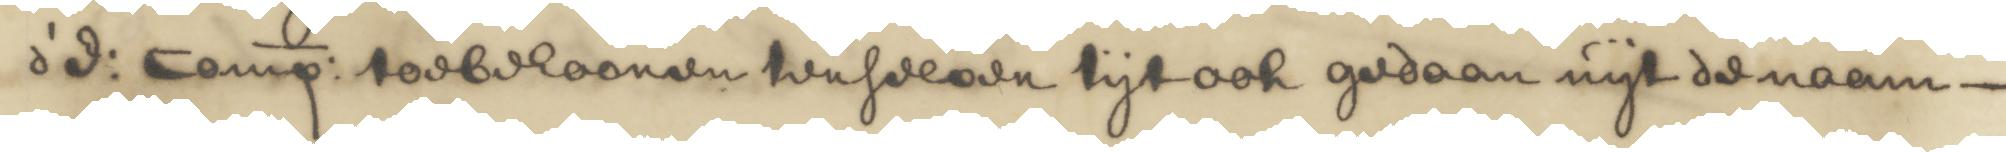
d’E: Comp: toebehooren terselver tijt ook gedaan uijt de naam —
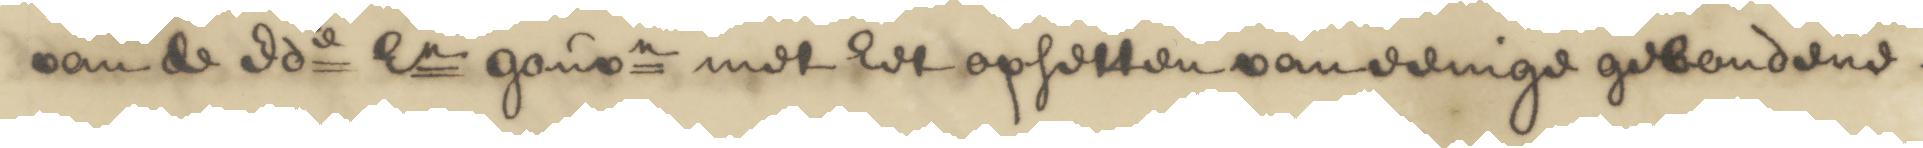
van de Ed=e h=r gouv=r met het opsetten van eenige gebondene
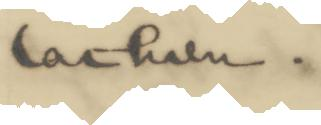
tacken.
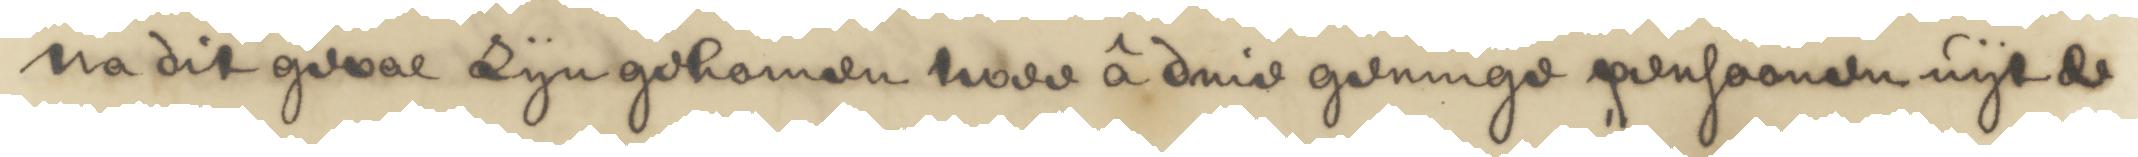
na dit geval zijn gekomen twee â drie geringe persoonen uijt de
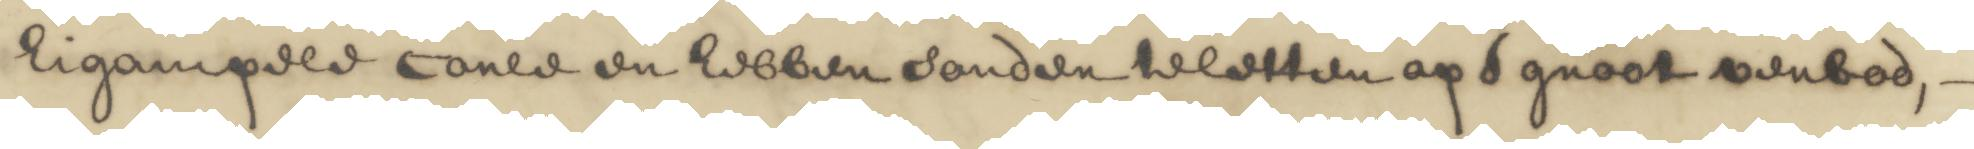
higampele corle en hebben sonder te letten op 't groot verbod,—
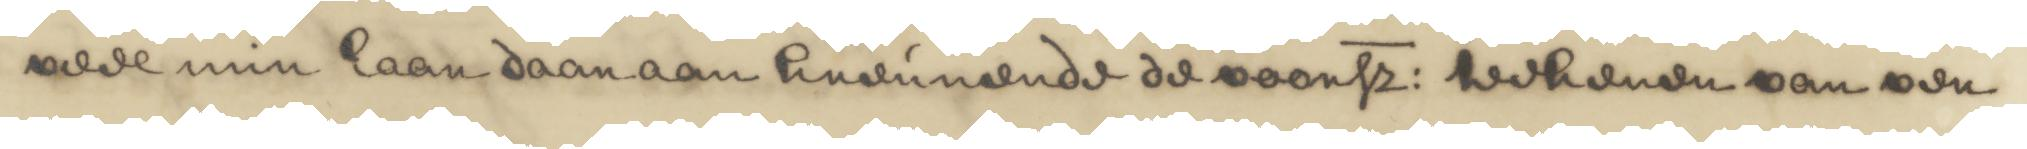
veel min haar daar aan kreunende de voorsz: teekenen van ver
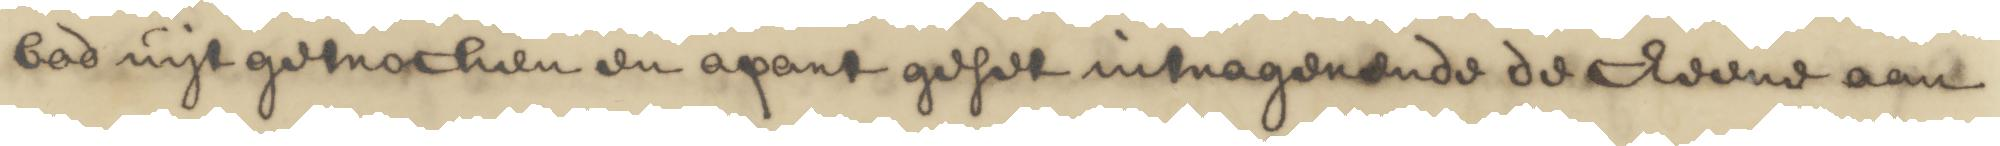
bod uijt getrocken en apart geset intragerende de cheene aan
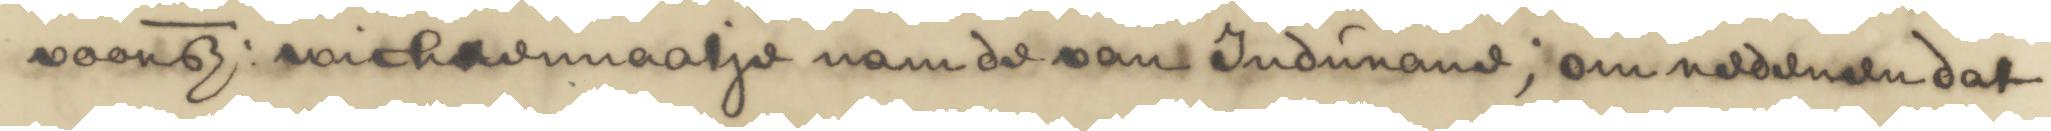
voors: wicktennaatje nam de van Indurane; om redenen dat
